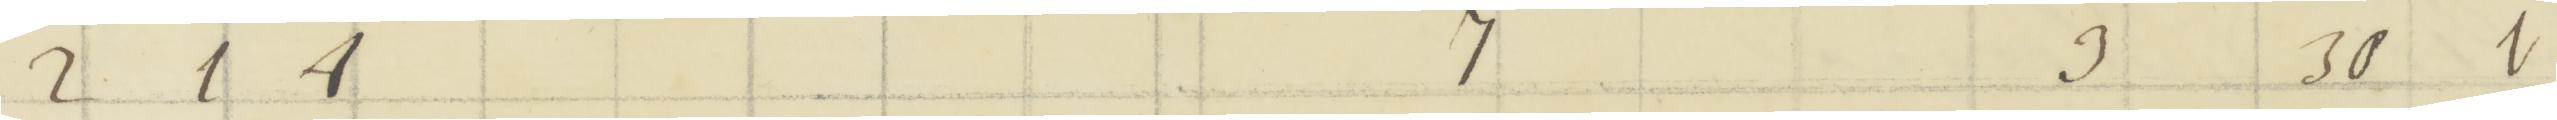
2 1 4 7 3 30 1
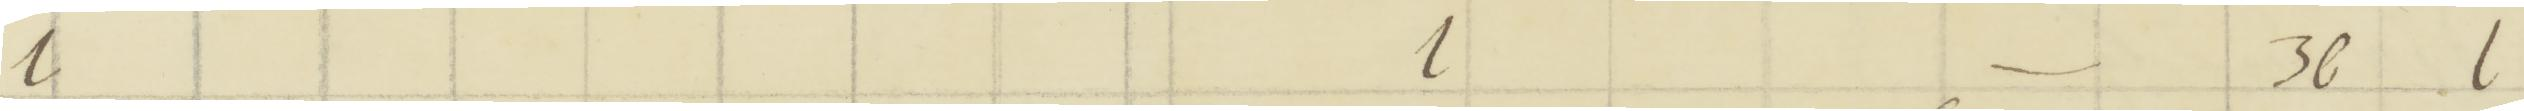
1 1 — 30 1
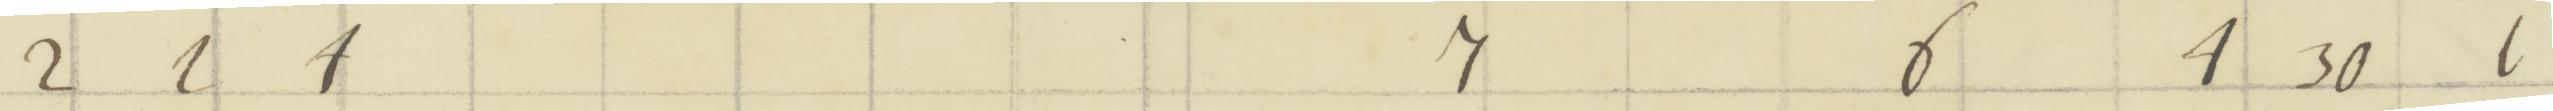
2 1 4 7 6 4 30 1
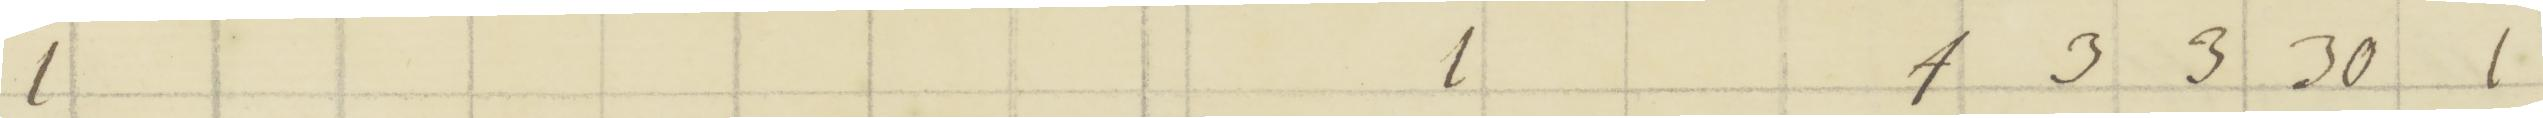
1 1 4 3 3 30 1
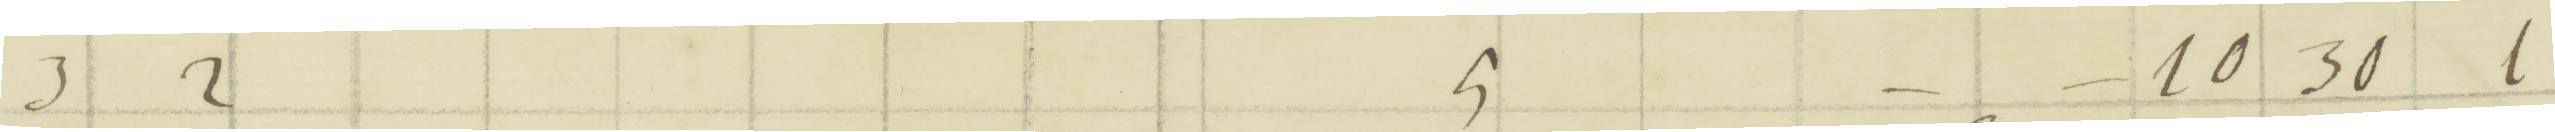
3 2 5 — — 10 30 1
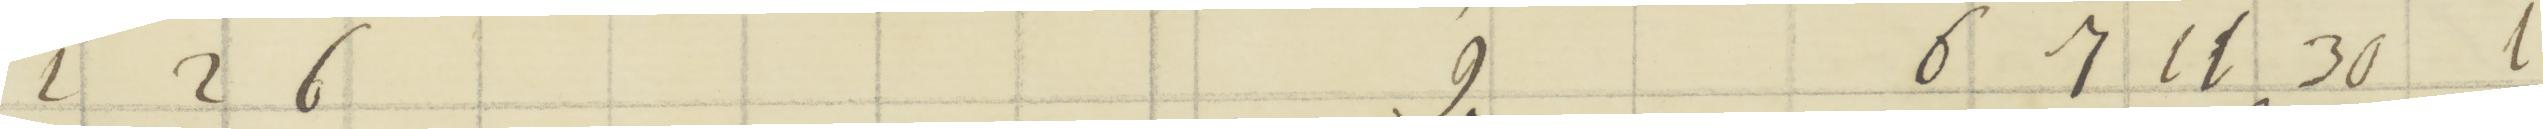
1 2 6 9 6 7 11 30 1
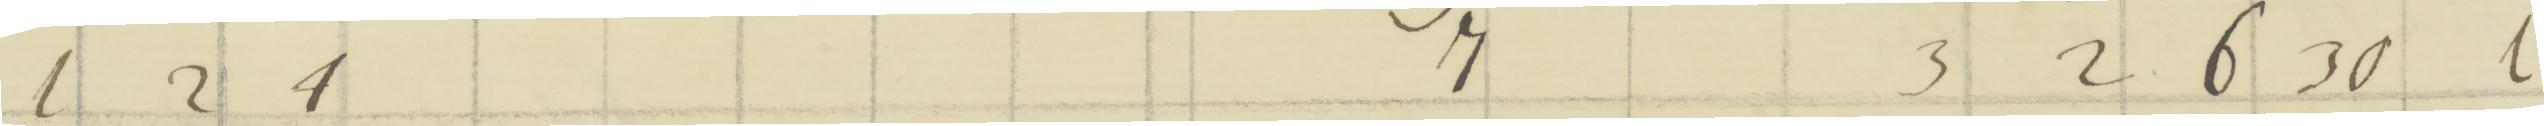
1 2 4 7 3 2 6 30 1
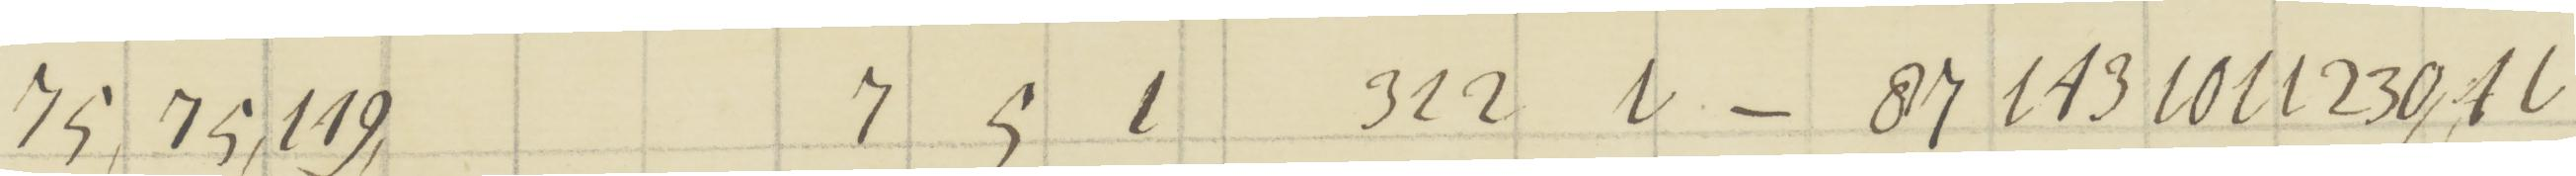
75, 75,119, 7 5 1 312 1 — 87 143 1011 1230, 41
